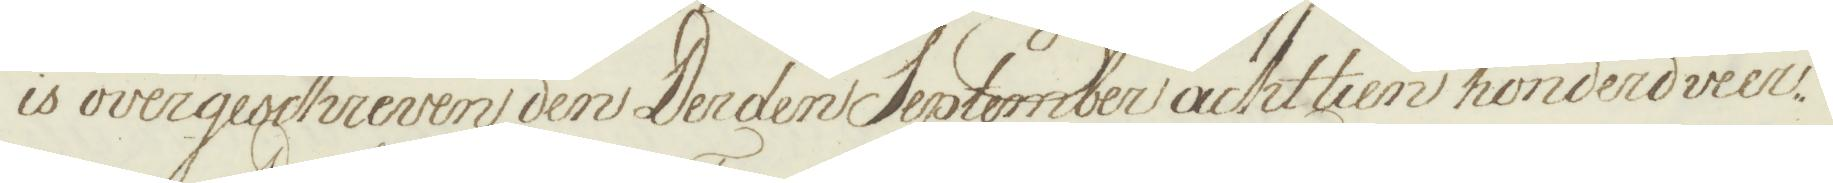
is overgeschreven den Derden September achttien honderd veer„
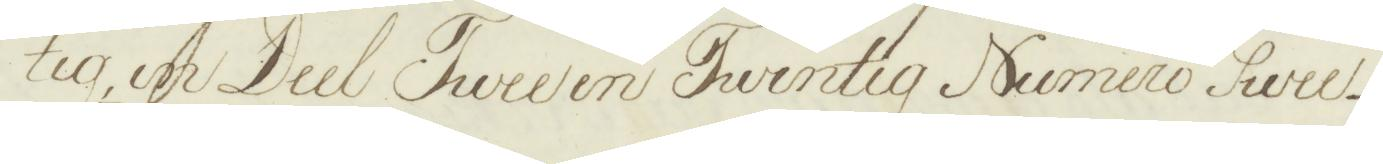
tig, in Deel Twee en Twintig Numero Twee
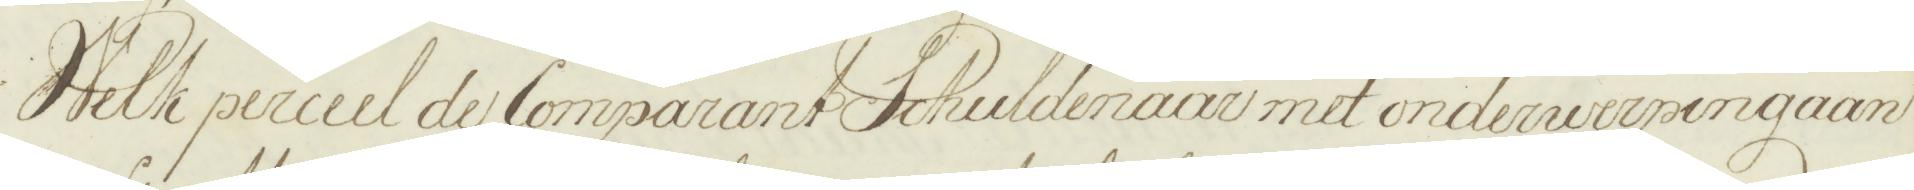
Welk perceel de Comparant Schuldenaar met onderwerping aan
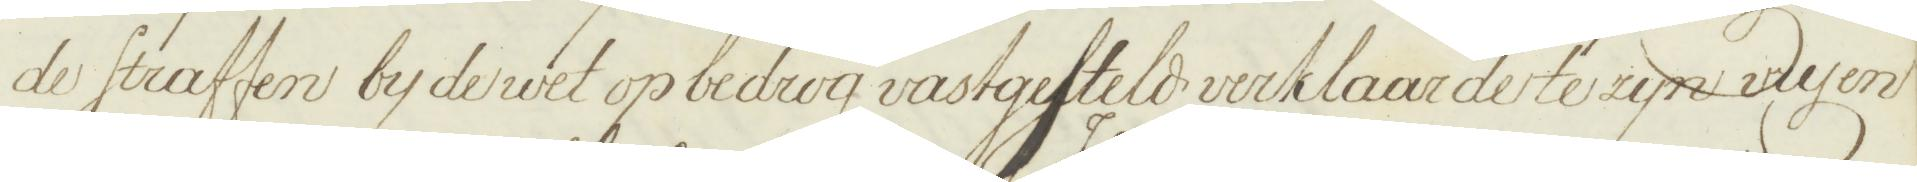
de straffen by de wet op bedrog vastgesteld verklaarde te zijn vry en
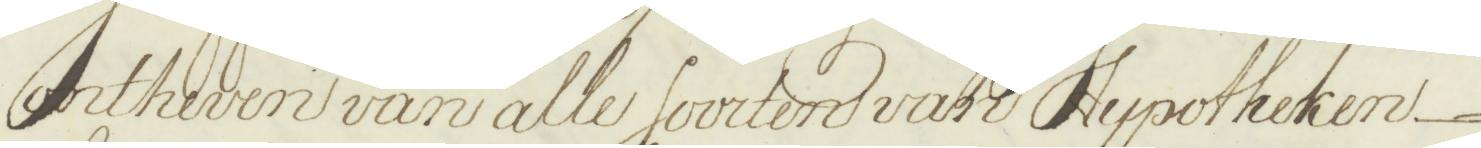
ontheven van alle soorten van Hypotheken.—
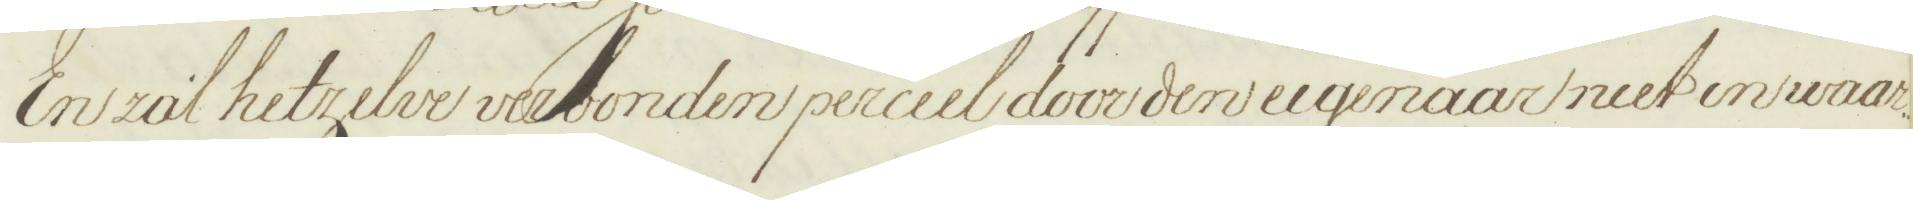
En zal hetzelve verbonden perceel door den eigenaar niet in waar„
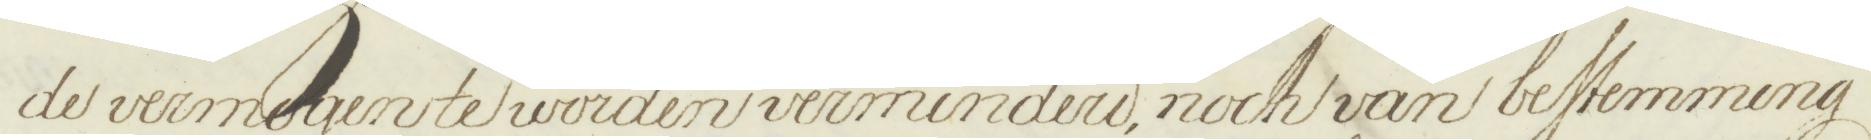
de vermogen te worden verminderd, noch van bestemming
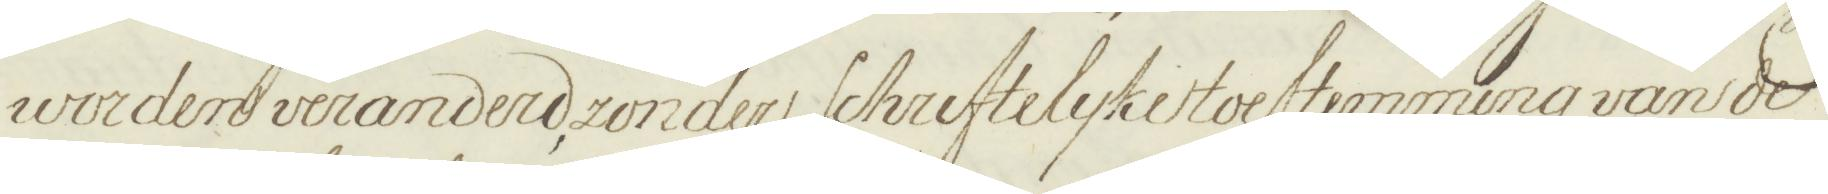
worden veranderd, zonder schriftelyke toestemming van de
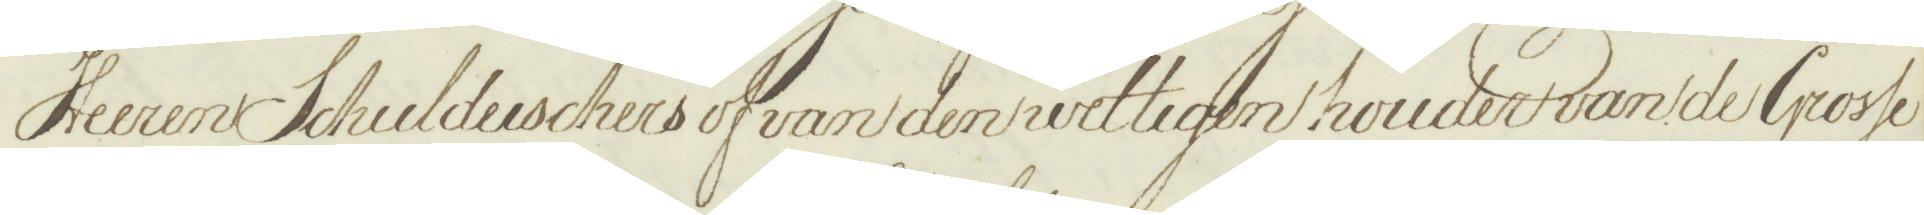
Heeren Schuldeischers of van den wettigen houder van de Grosse
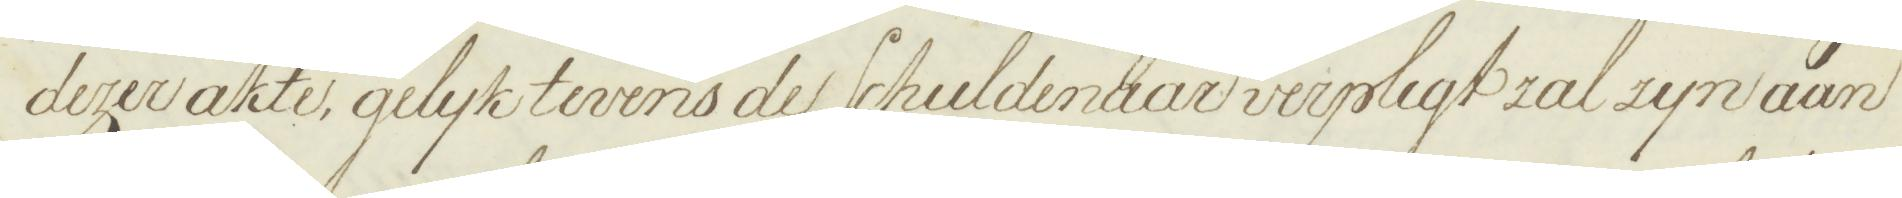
dezer akte, gelyk tevens de schuldenaar verpligt zal zyn aan
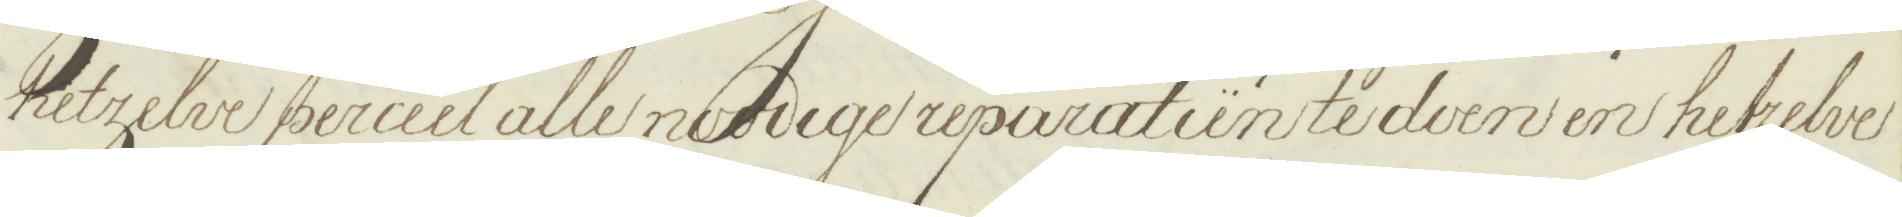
hetzelve perceel alle noodige reparatien te doen en hetzelve
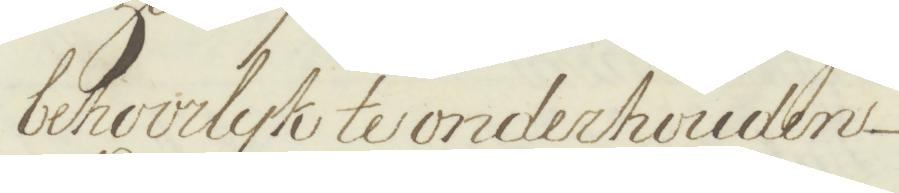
behoorlyk te onderhouden—
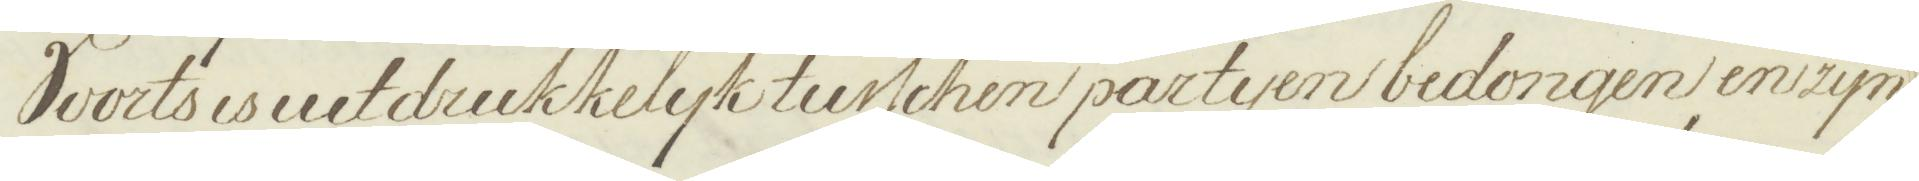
Voorts is uitdrukkelyk tusschen partyen bedongen en zyn
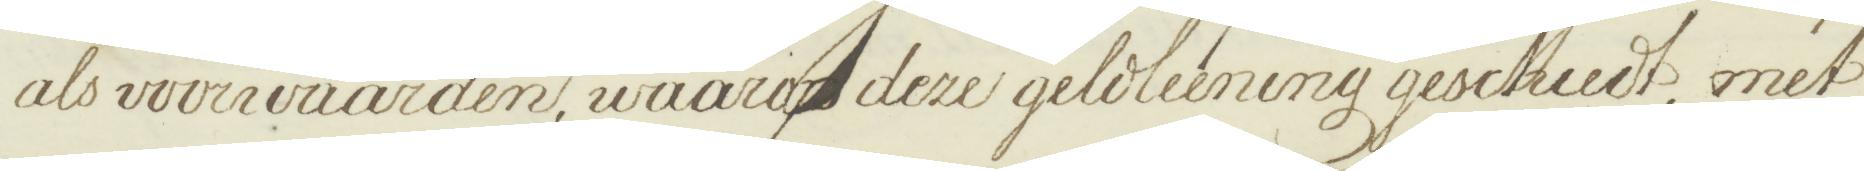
als voorwaarden, waarop deze geldleening geschiedt, met
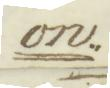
on„
